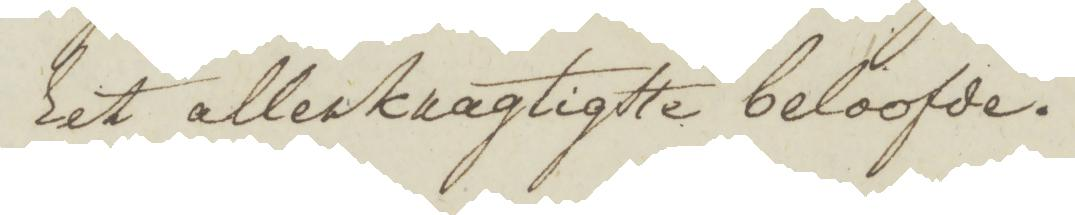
het allerkragtigste beloofde.
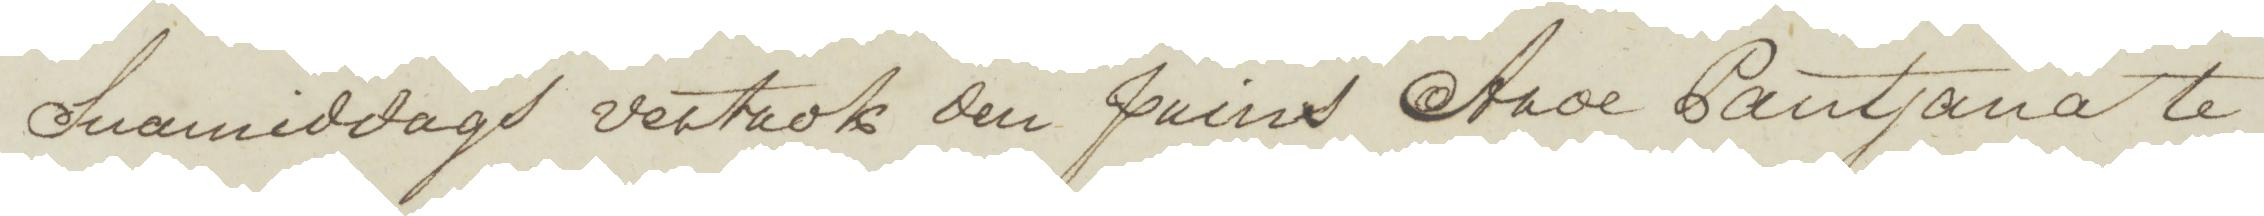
Snamiddags vertrok den prins Aroe Pantjana te
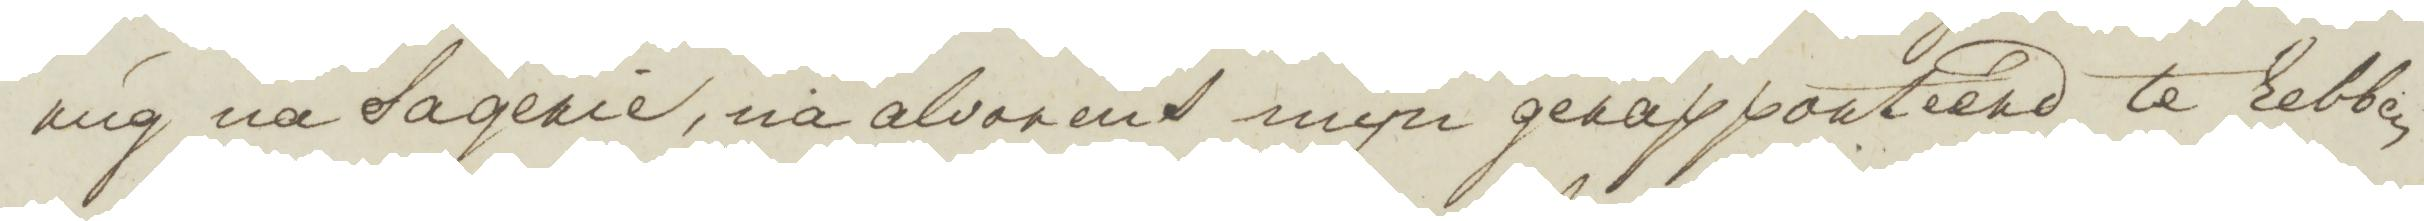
rug na Sagerie, na alvorens mijn gerapporteerd te hebben
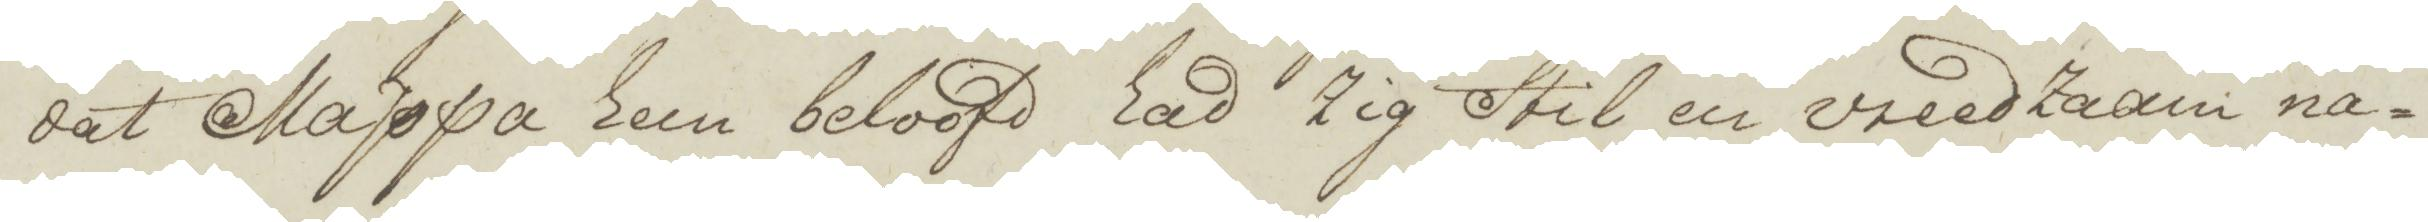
dat Mappa hem beloofd had zig stil en vreedzaam na=
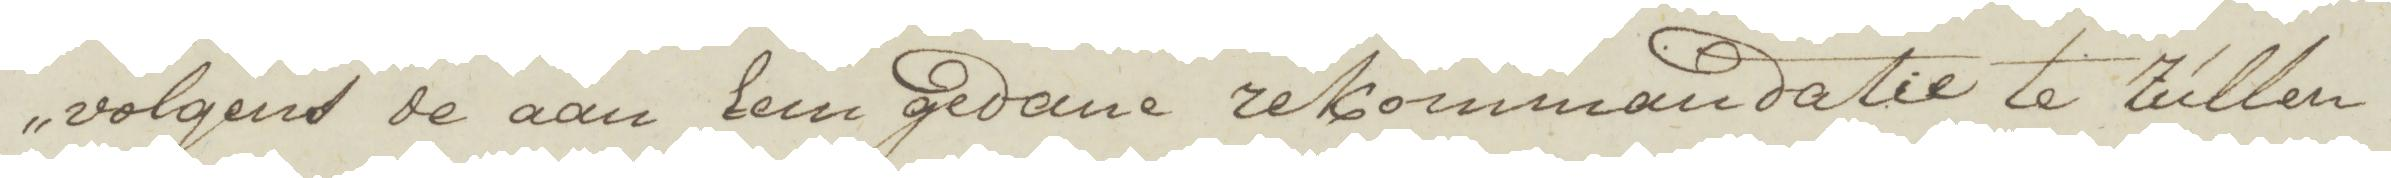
„volgens de aan hem gedane rekommandatie te zullen
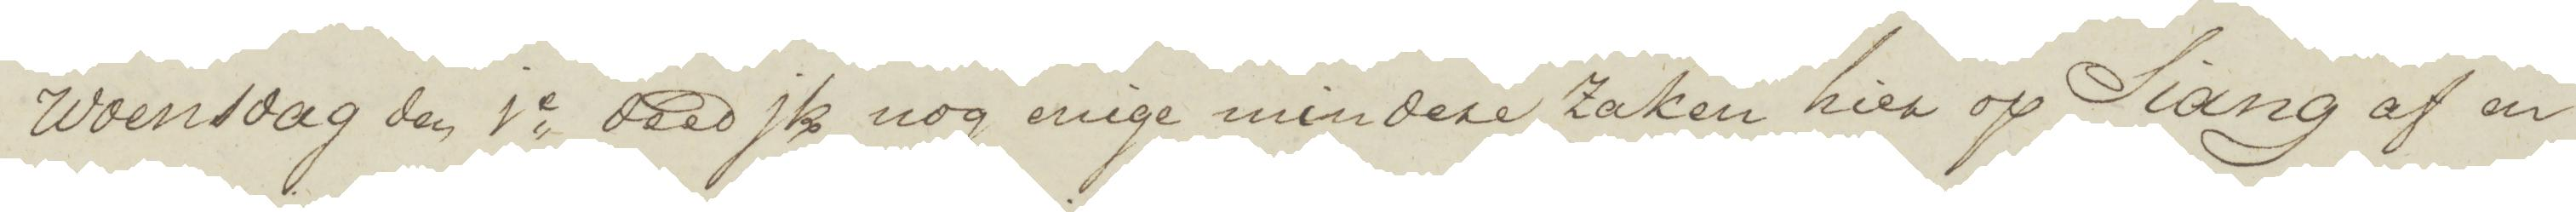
woensdag den 1„e deed jk nog enige mindere zaken hier op Siang af en
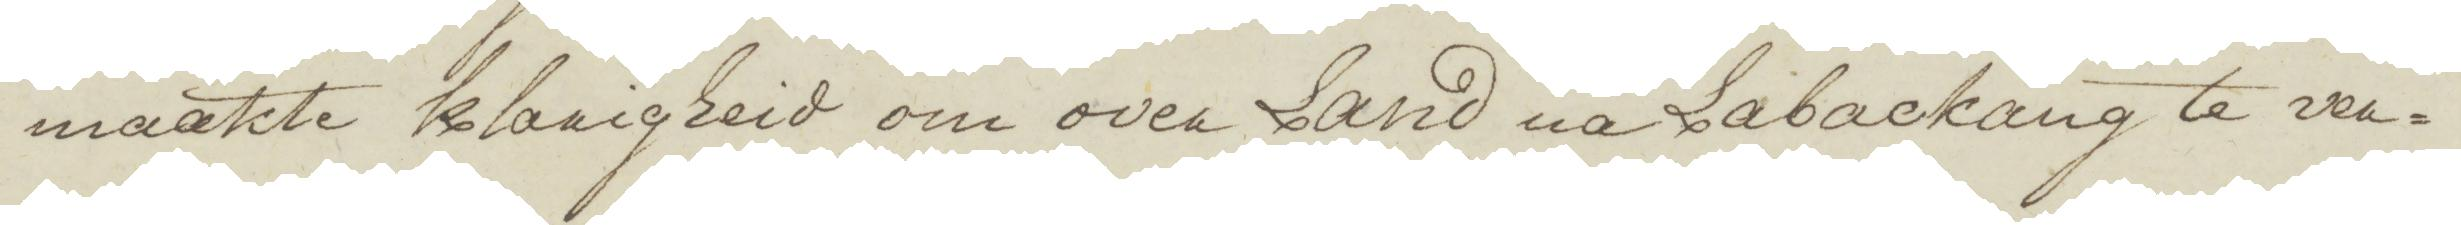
maakte klarigheid om over Land na Labackang te ver=
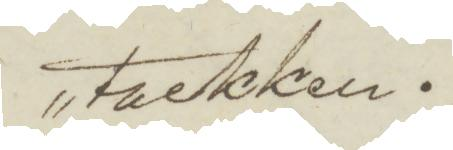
„trekken.
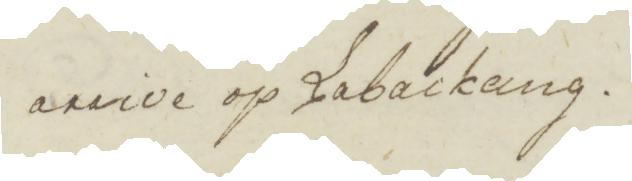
arrive op Labackang.
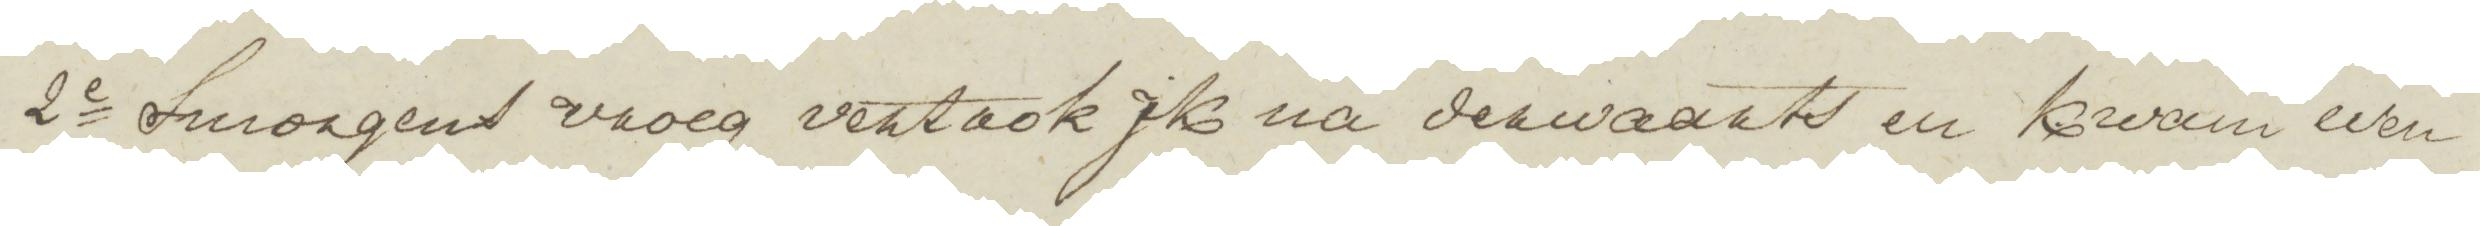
2=e Smorgens vroeg vertrok jk na derwaarts en kwam even
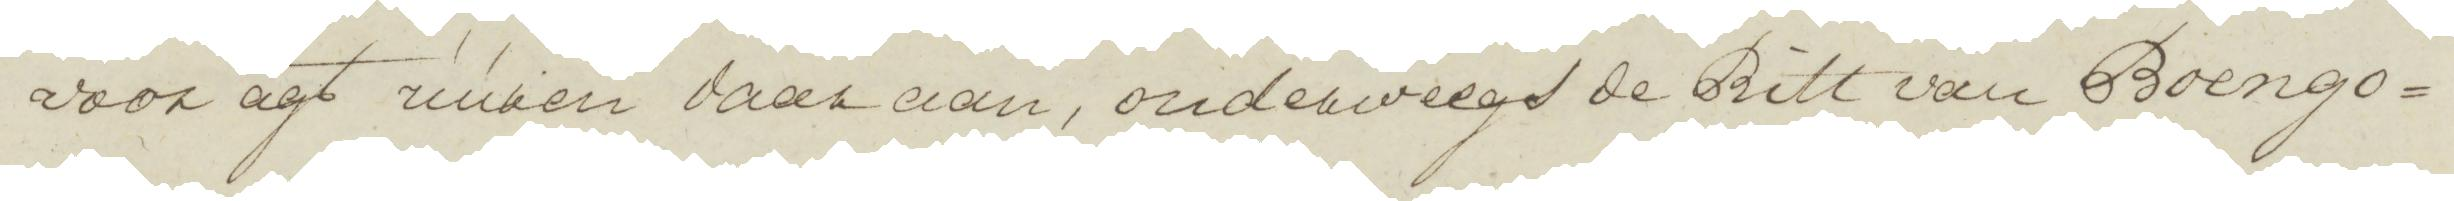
voor agt uuren daar aan, onderweegs de Bitt van Boengo=
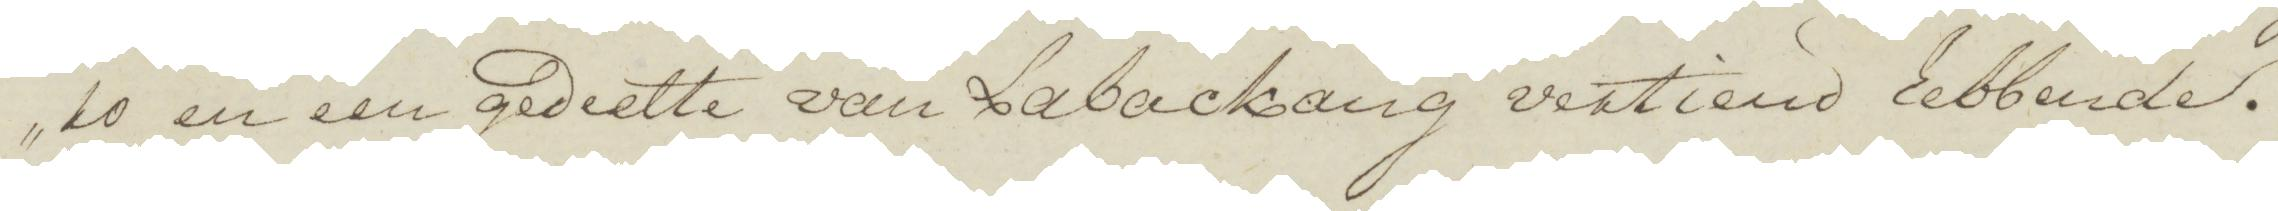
„to en een gedeelte van Labackang vertiend hebbende.
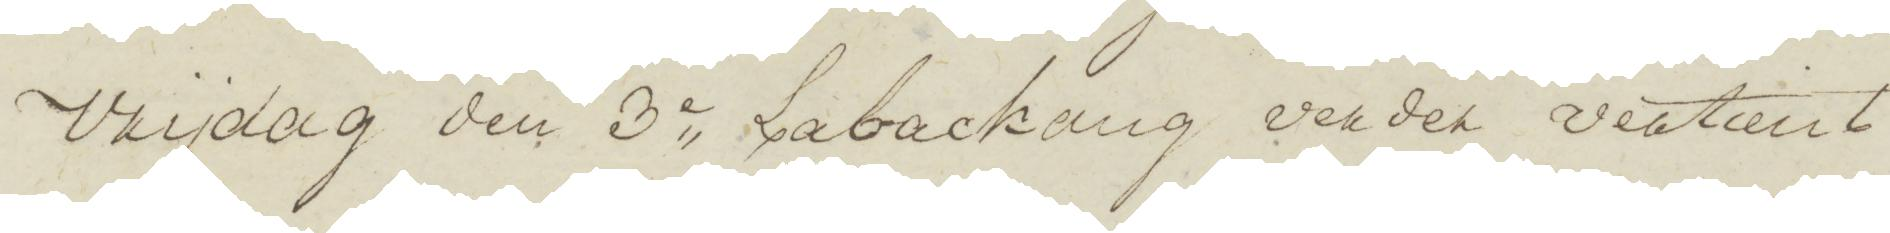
Vrijdag den 3„e Labackang verder vertient
